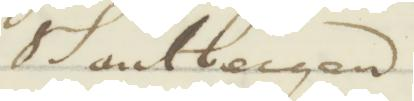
V Santbergen
